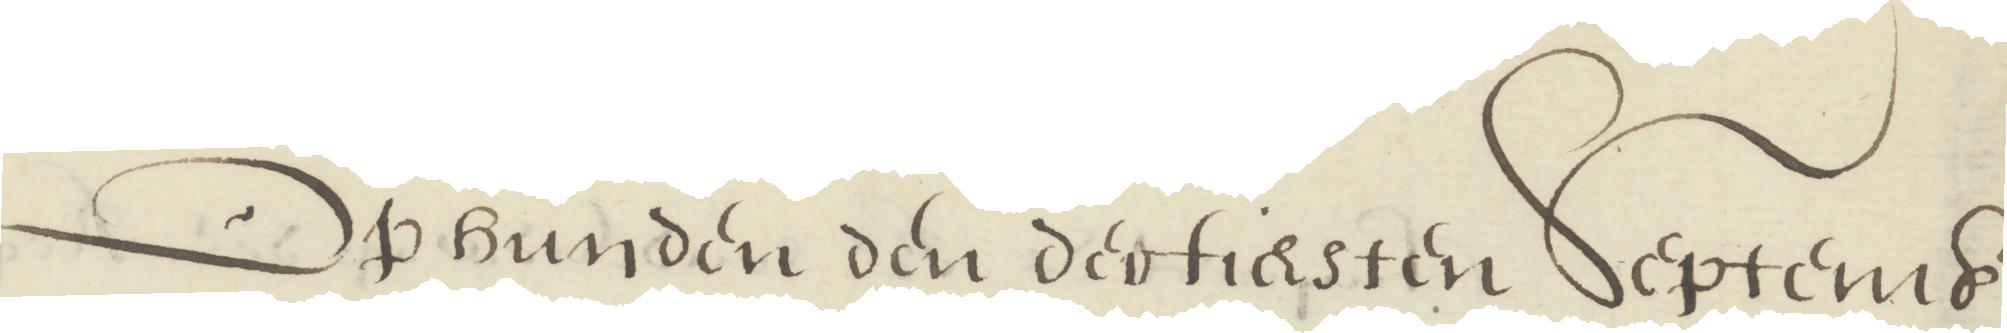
Op huijden den dertichsten septemb
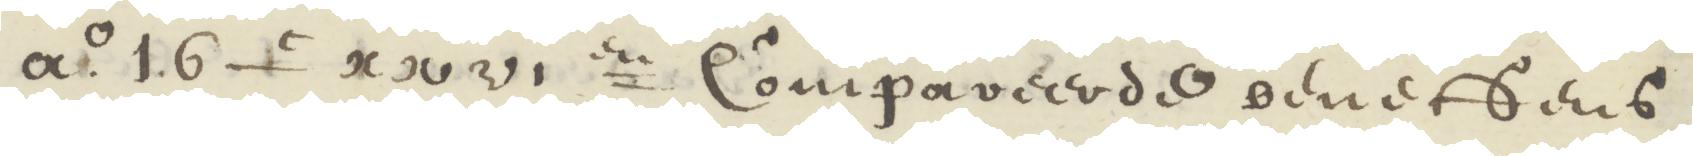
a:o 16c xxvi =en Compareerde beneffens
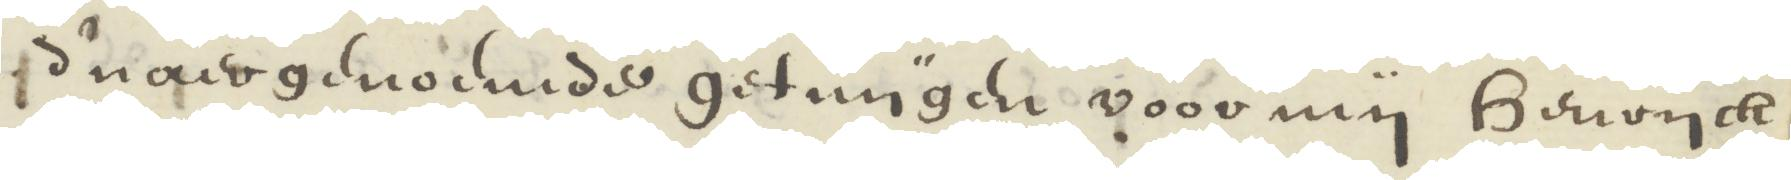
d' naer genoemde getuijgen voor mij henrijck
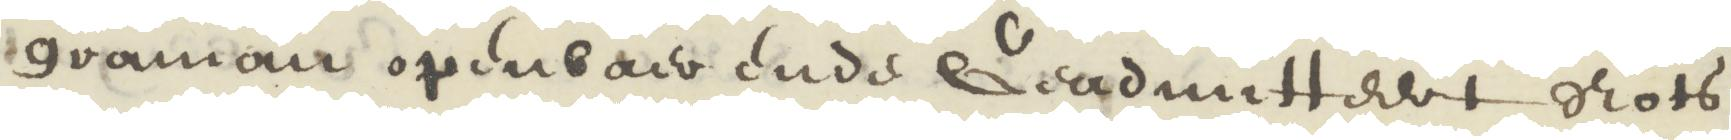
graman openbaer ende Geadmitteert Nots
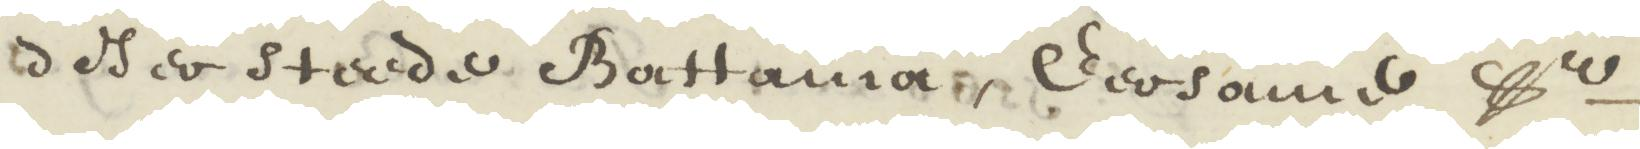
deser steede Battauia, Eersame Hr
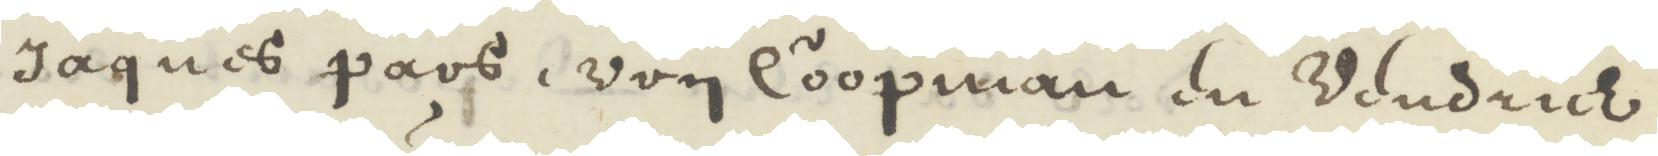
Jaques pars, vrij Coopman en Vendrich
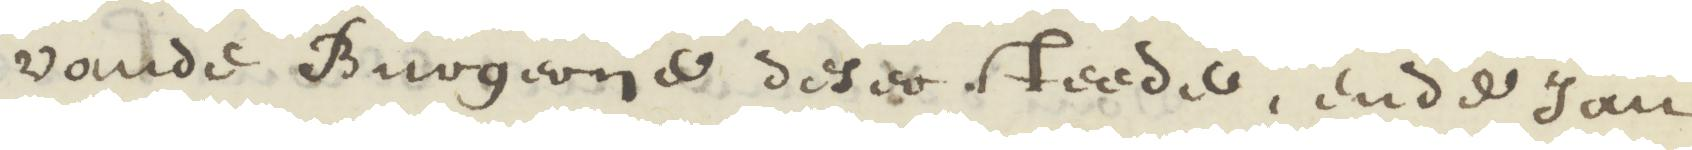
vande Burgerije deser steede, ende Jan
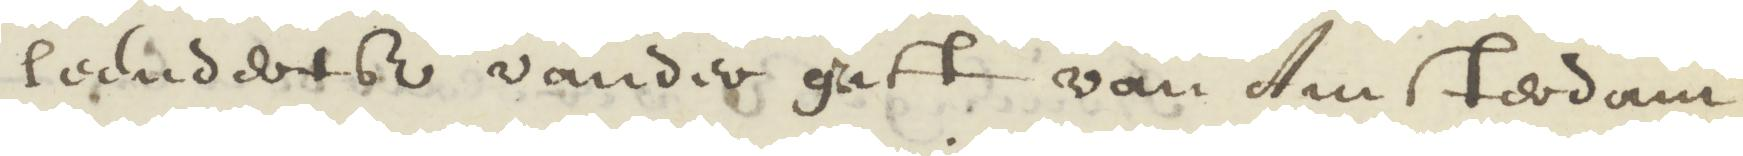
leendertsz van der grift van Amsterdam
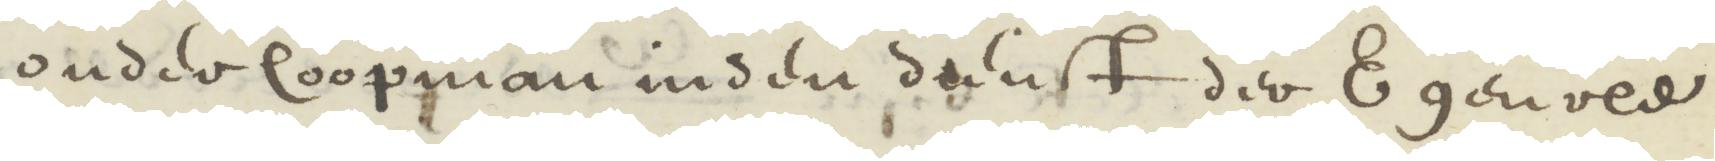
onder Coopman in den dienst der E gen rle
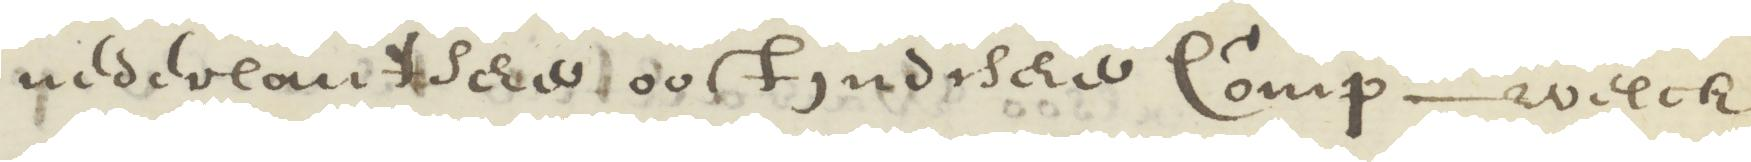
nederlantsche oost indische Comp=e welck
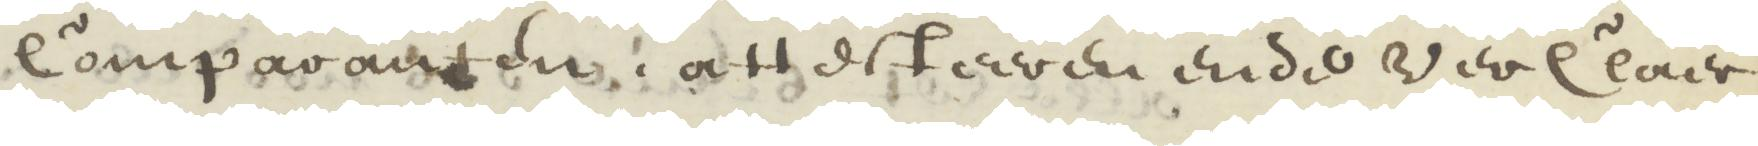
Comparanten attesteeren ende verclaern
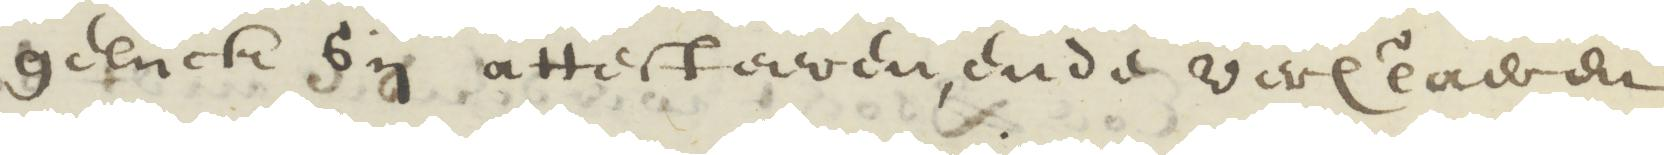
gelijck bij attesteeren, ende verclaeren
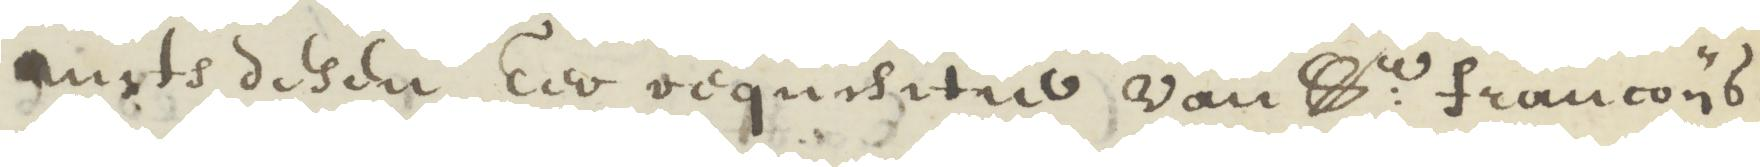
mits desen Ter requisitie van H:r Francoijs
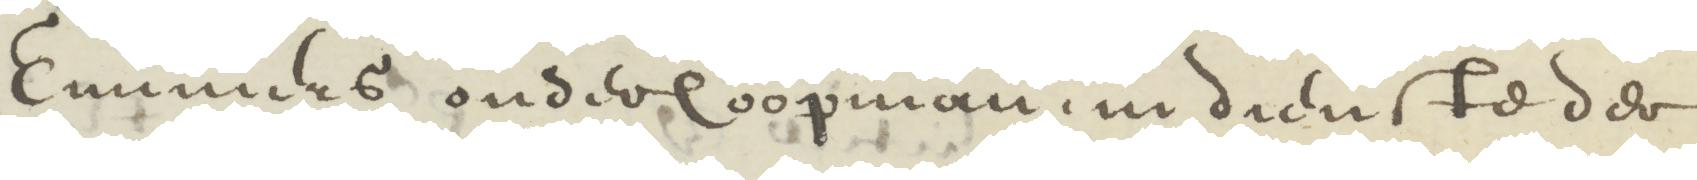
Ennincks onderCoopman, in dienste der
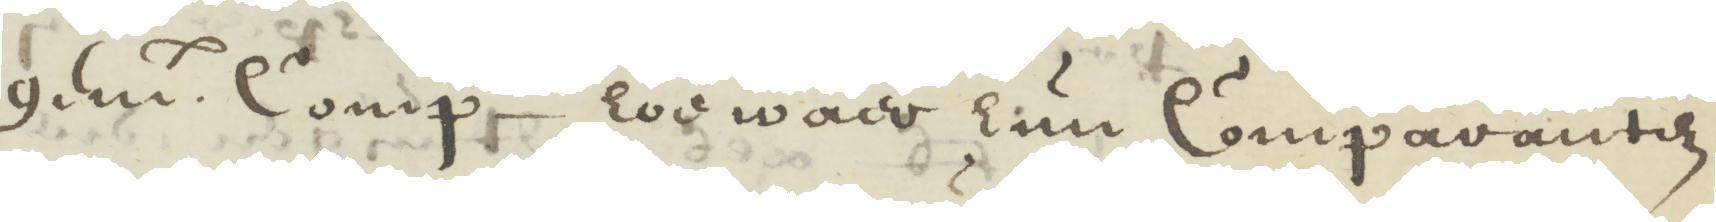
gem. Comp -e hoe waer hun Comparanten
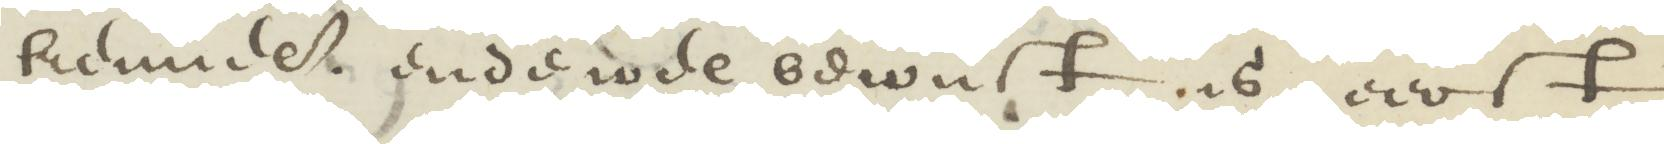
kennelijk ende wel bewust is, eerst
